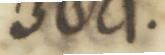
384.
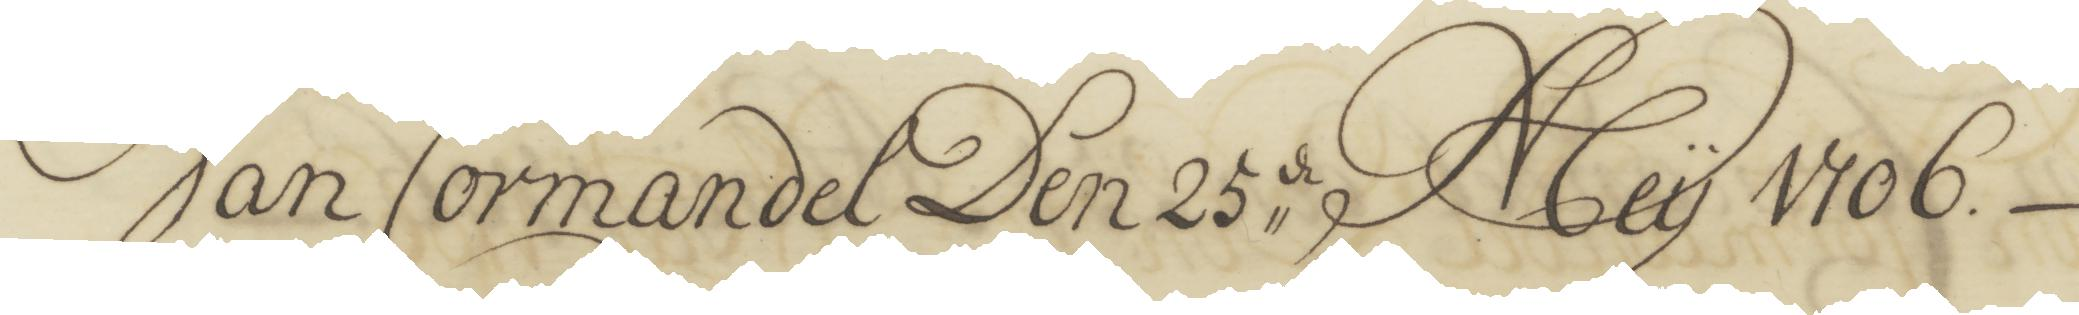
Van Cormandel Den 25„e Meij 1706. —
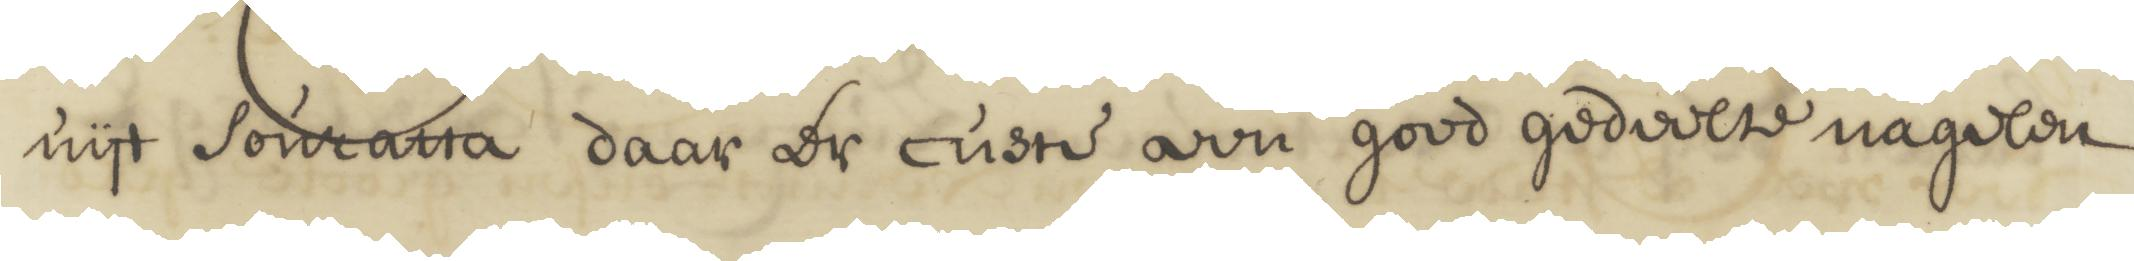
uijt souratta daar ter custe een goed gedeelte nagelen
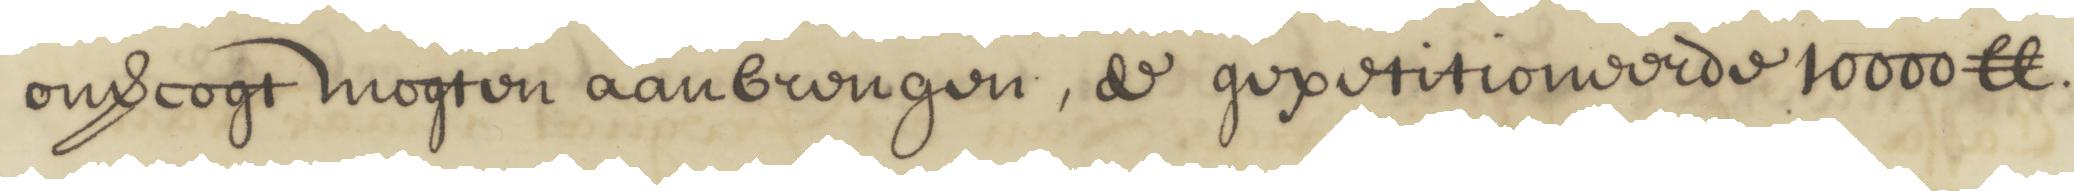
onvercogt mogten aan brengen, de gepetitioneerde 10000 lb.
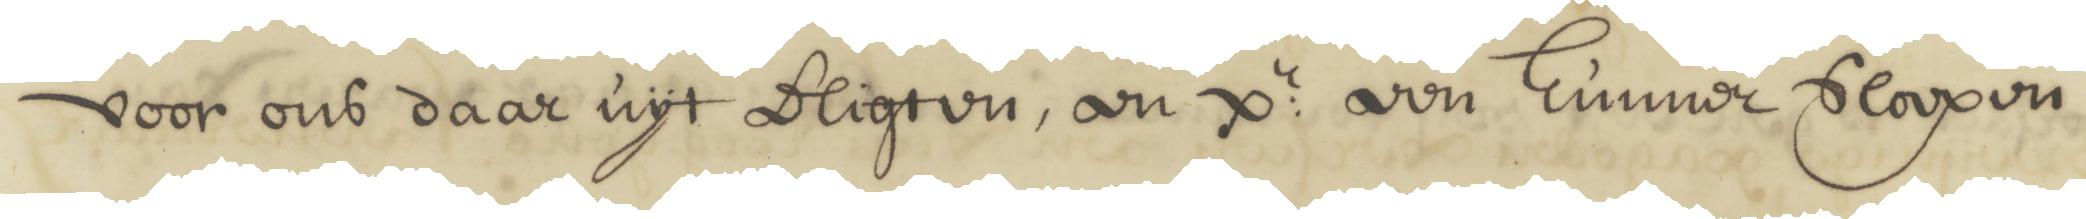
voor ons daar uijt teligten, en p:r een hunner sloepen
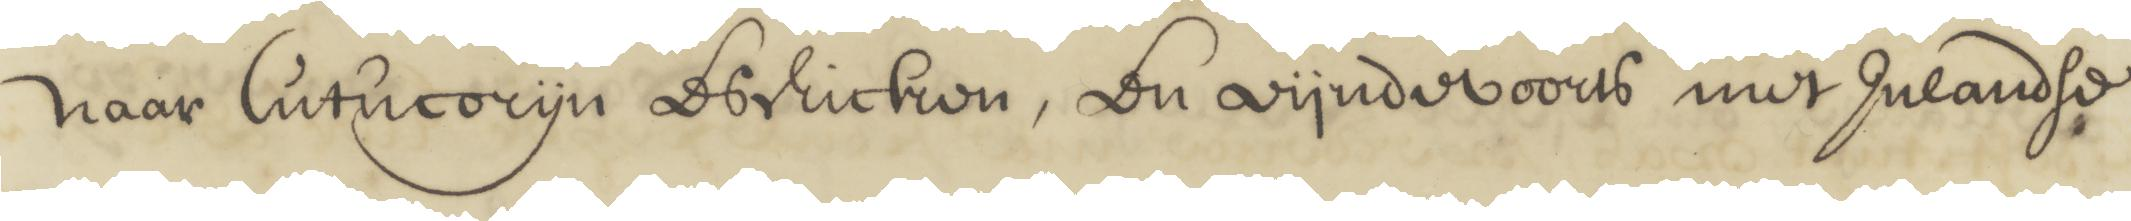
naar tutucorijn teschicken, ten eijnde voorts met Jnlandse
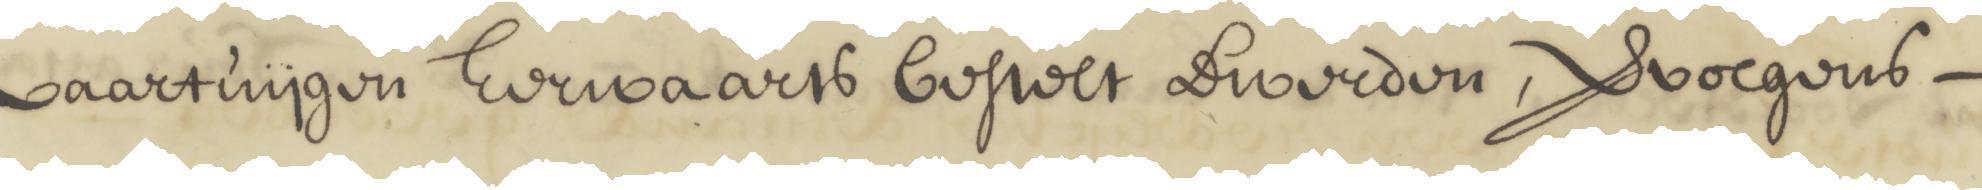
vaartuijgen herwaarts bestelt tewerden, vervolgens —
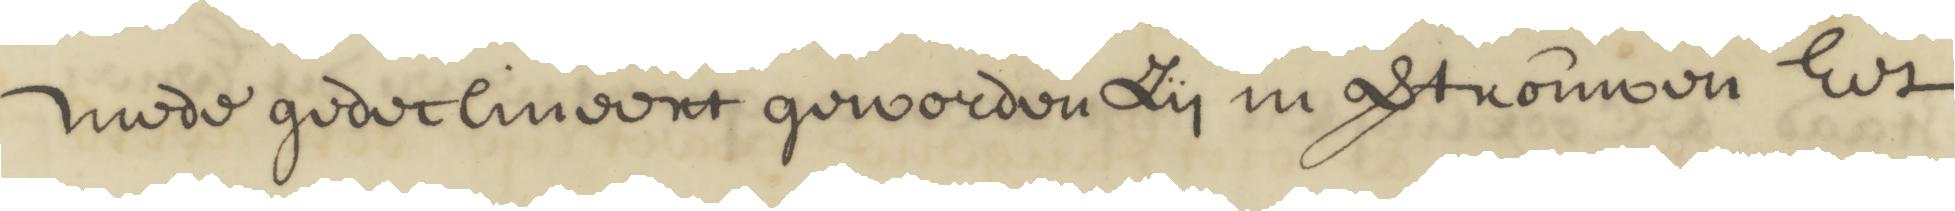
mede gedeclineert geworden zij in vertrouwen het
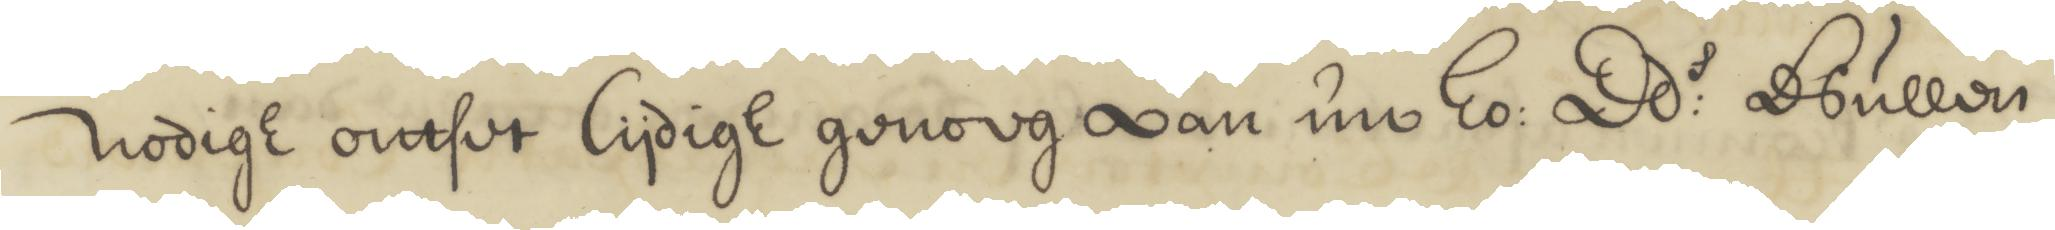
nodigh ontset tijdigh genoeg van uw ho: Ed:s tesullen
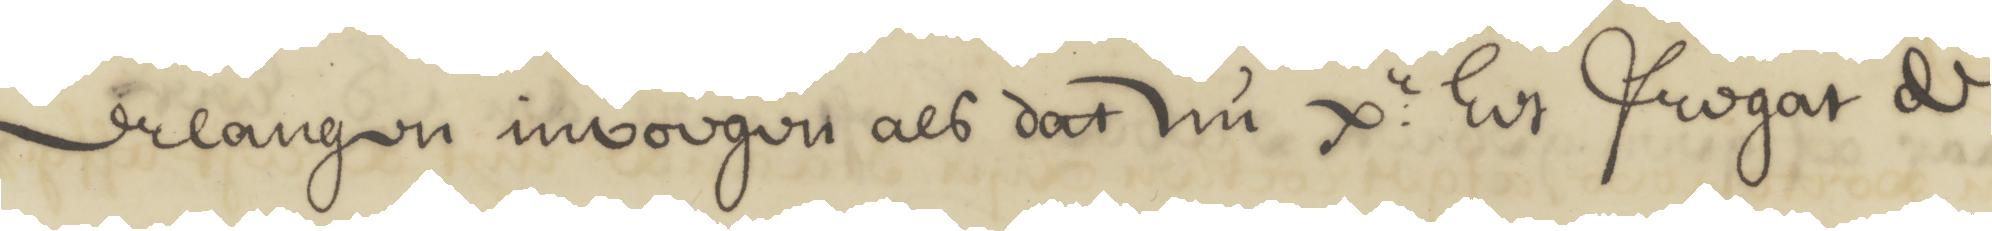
erlangen invoegen als dat nu p:r het fregat de
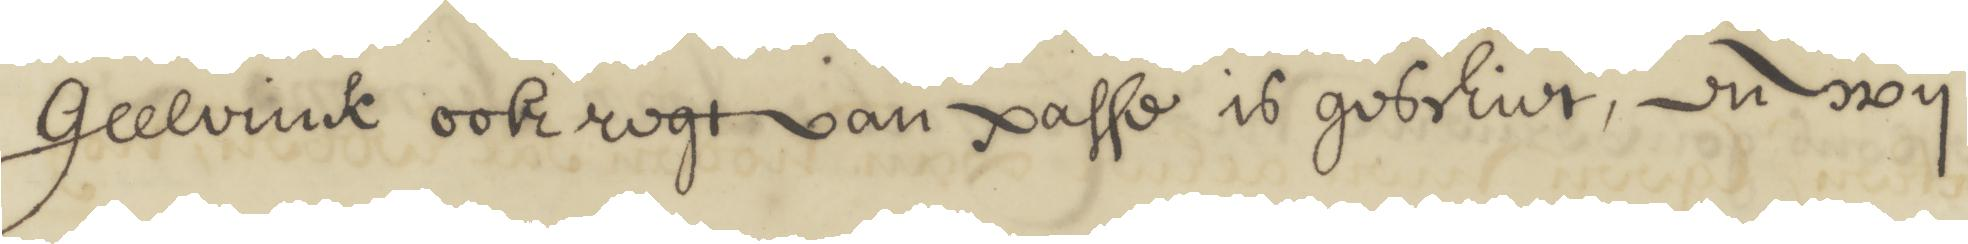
geelvink ook regt van passe is geschiet, en wij
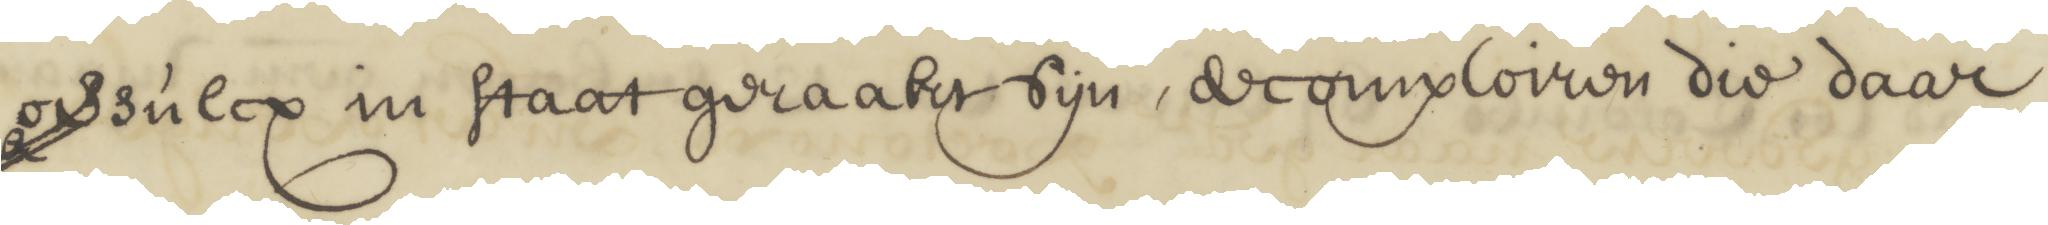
oversulcx in staat geraakt sijn, de comptoiren die daar
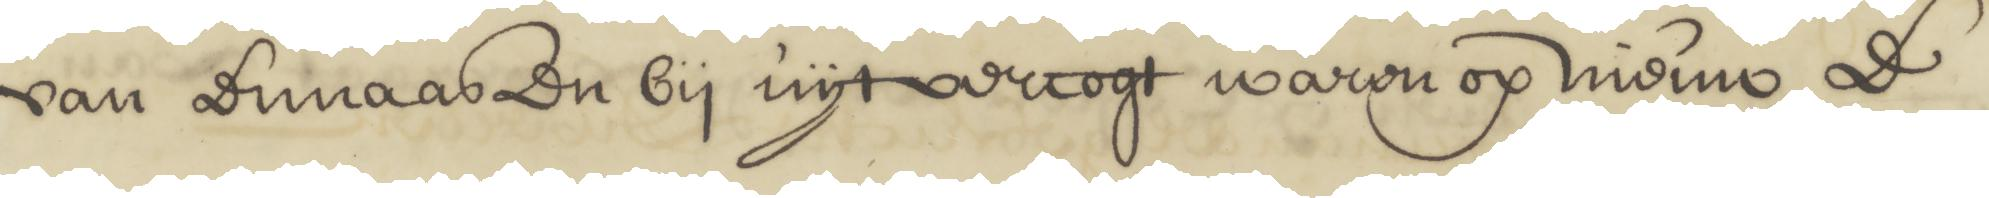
van tennaasten bij uijtvercogt waren op nieuw te
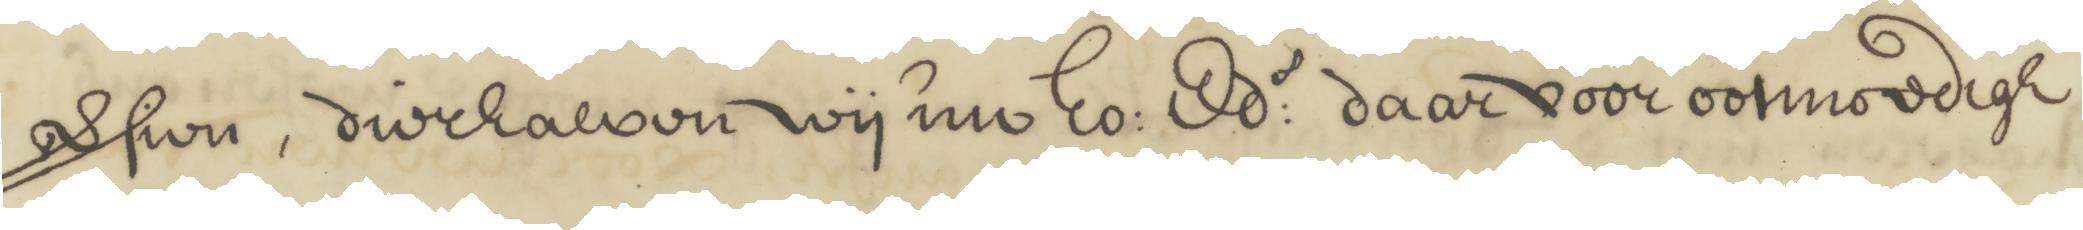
versien, dierhalven wij uw ho: Ed:s daar voor ootmoedigh
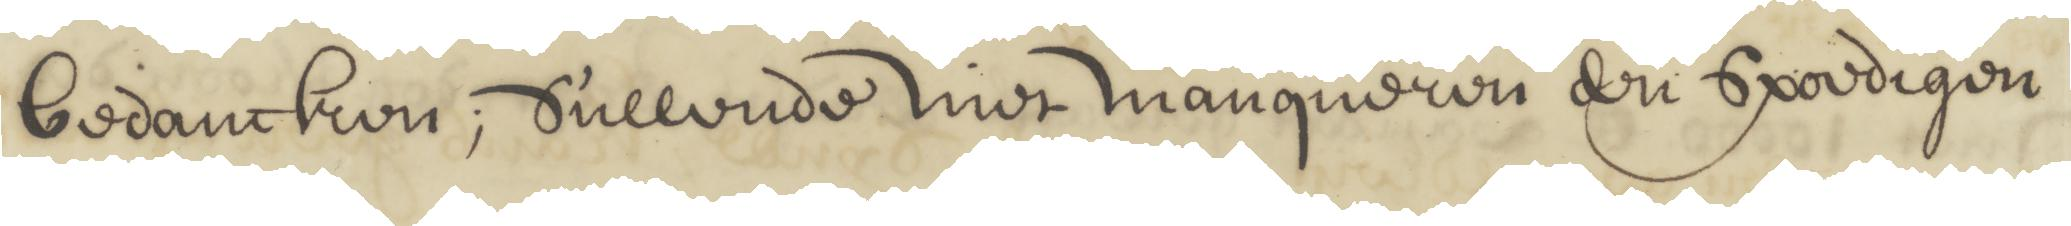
bedancken; sullende niet manqueren den spoedigen
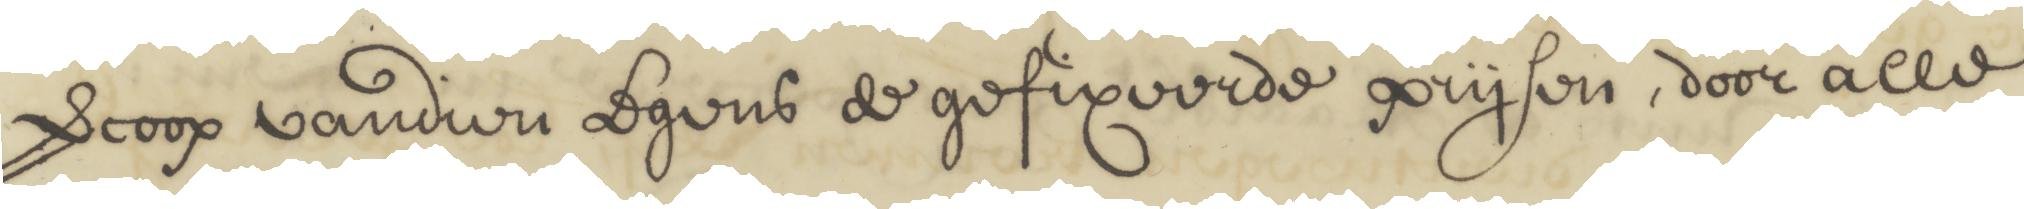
vercoop vandien tegens de gefixeerde prijsen, door alle
